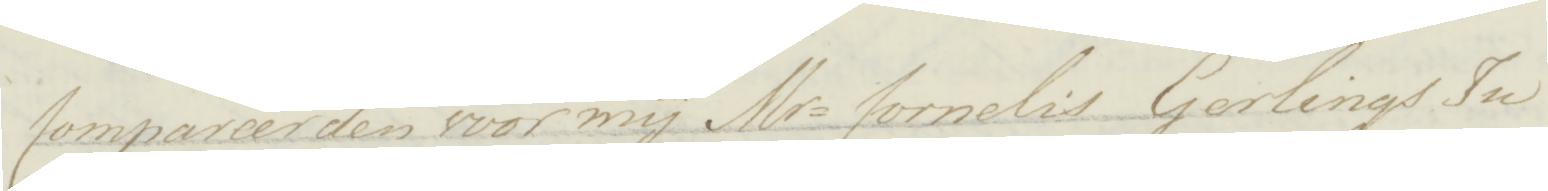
Compareerden voor mij Mr= Cornelis Gerlings Ju
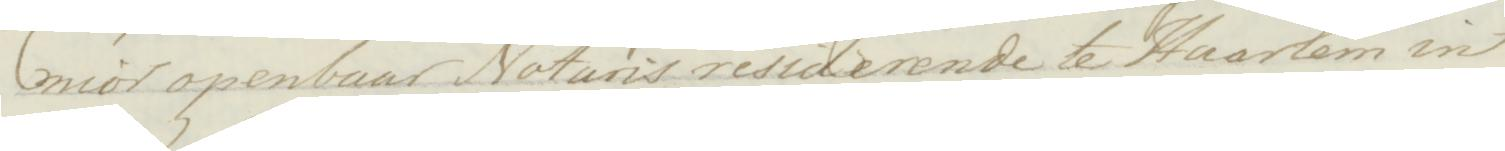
nior openbaar Notaris residerende te Haarlem in
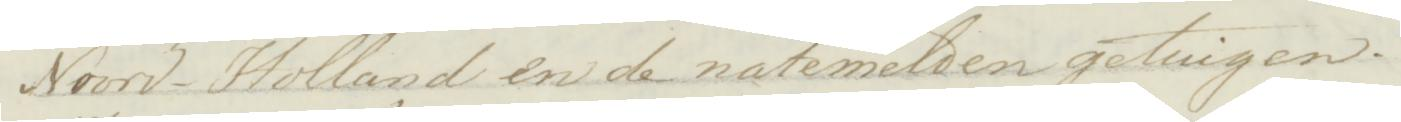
Noord-Holland en de natemelden getuigen.
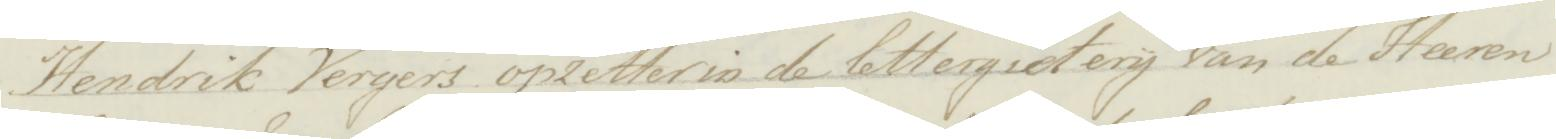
Hendrik Vergers opzetter in de lettergieterij van de Heeren
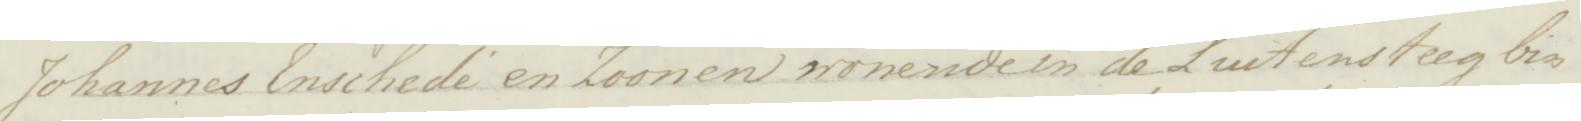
Johannes Enschede en zoonen wonende in de Luitensteeg bin
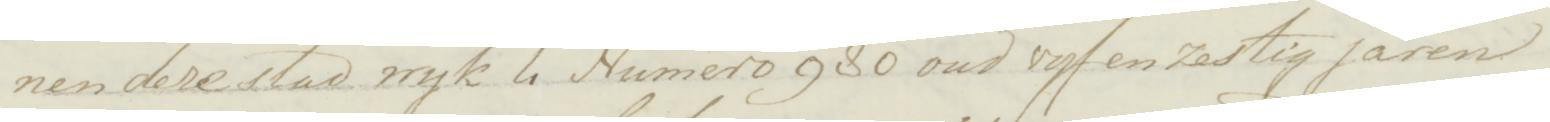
nen deze stad wyk 4 Numero 980 oud vyf en zestig jaren
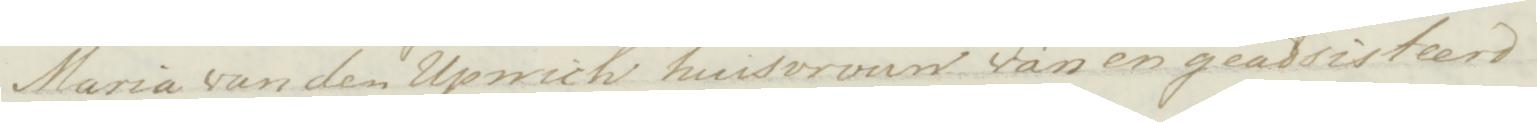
Maria van den Upwich huisvrouw van en geadsisteerd
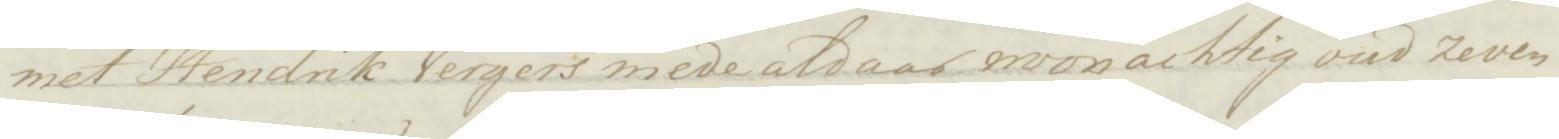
met Hendrik Vergers mede aldaar woonachtig oud zeven
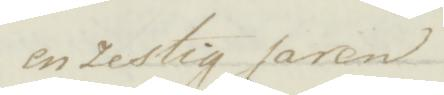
en zestig jaren
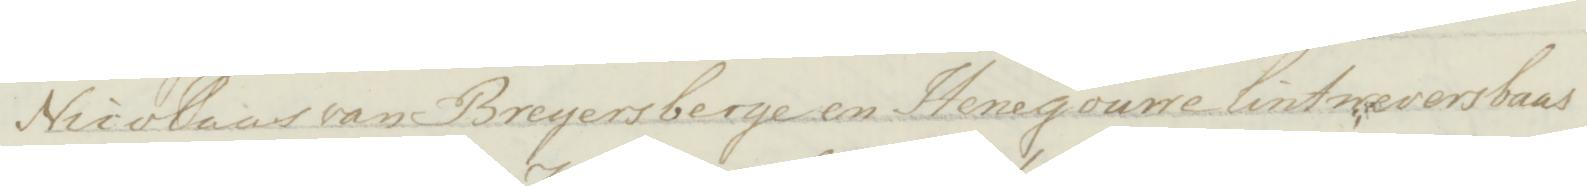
Nicolaas van Breyersberge en Henegouwe lintweversbaas
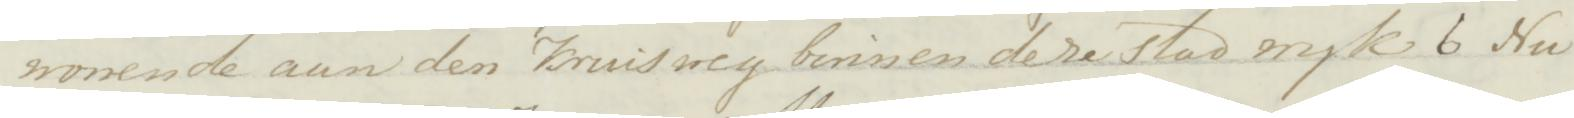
wonende aan den Kruisweg binnen deze stad wyk 6 Nu
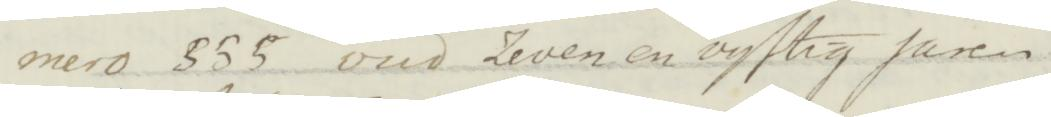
mero 555 oud zeven en vyftig jaren
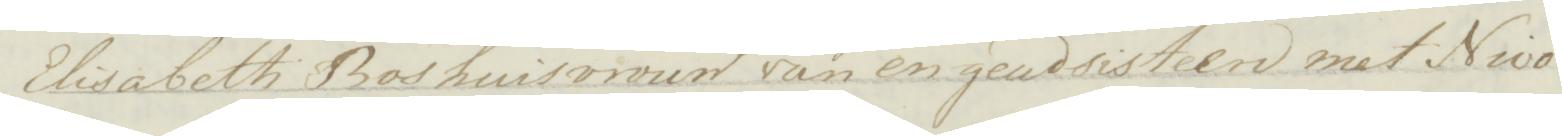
Elisabeth Bos huisvouw van en geadsisteen met Nico
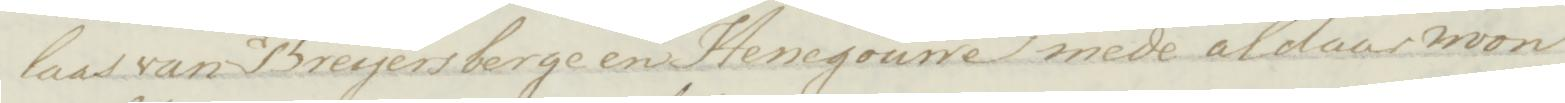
laas van Breyersberge en Henegouwe mede aldaar woon
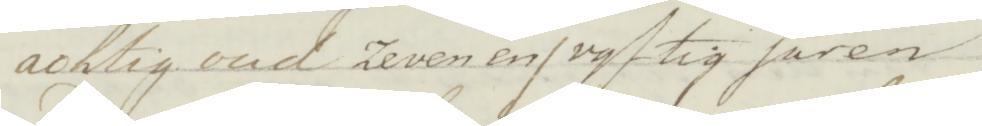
achtig oud zeven en vyftig jaren
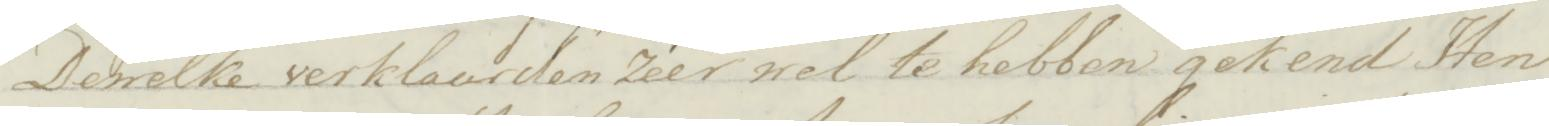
Dewelke verklaarden zeer wel te hebben gekend Hen
